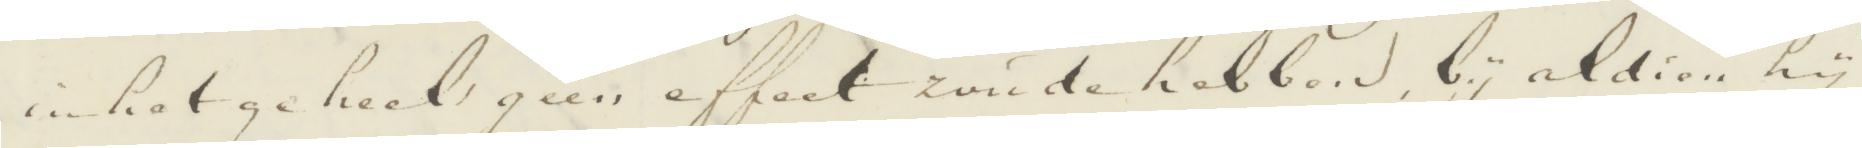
in het geheel geen effect zoude hebben bij aldien hij
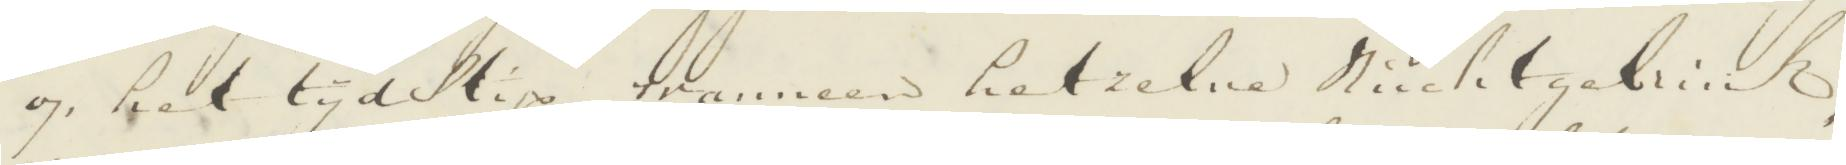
op het tijdstip, wanneer hetzelve vruchtgebruik,
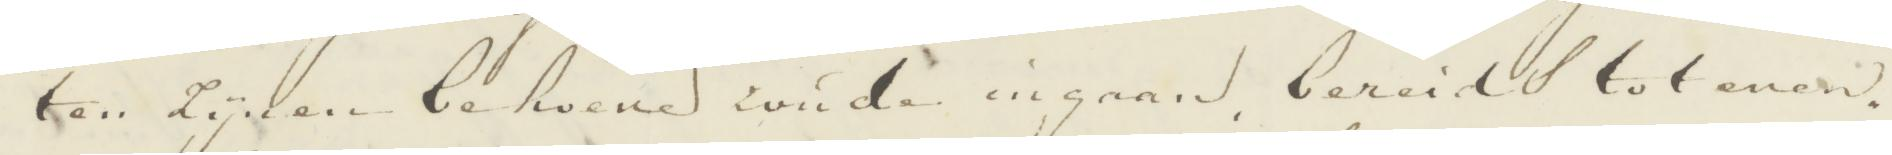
ten zijnen behoeve zoude ingaan bereids tot even„
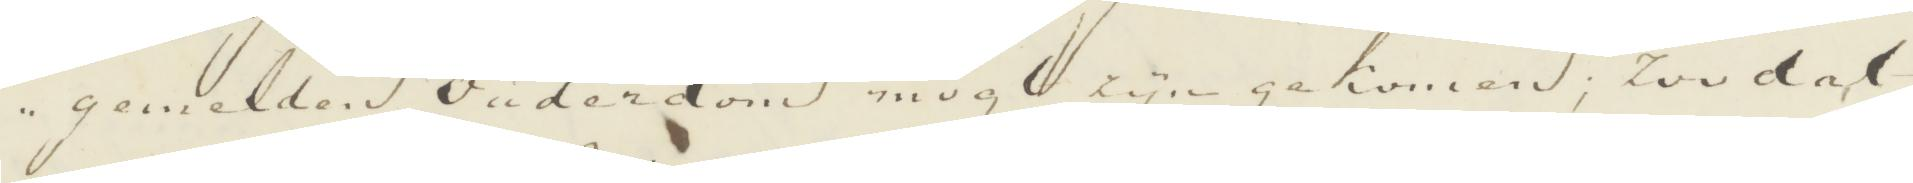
„gemelden ouderdom mogt zijn gekomen; zoo dat
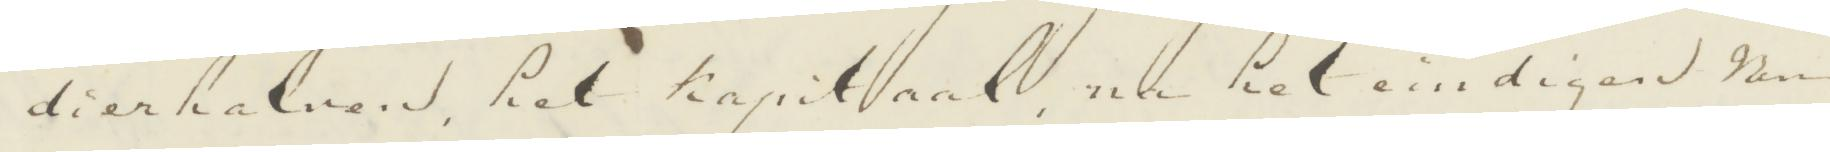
dierhalven, het kapitaal, na het eindigen van
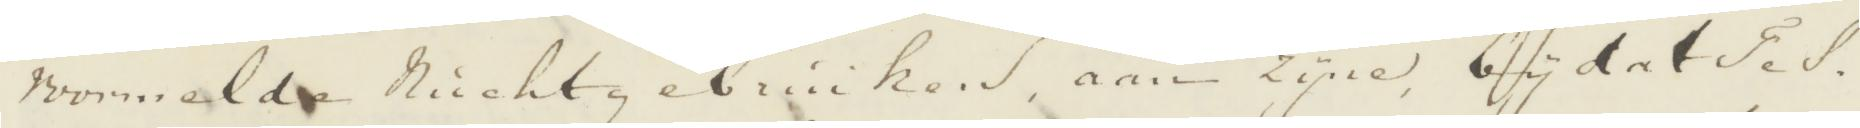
voormelde vruchtgebruiken, aan zijne, bij dat Tes.
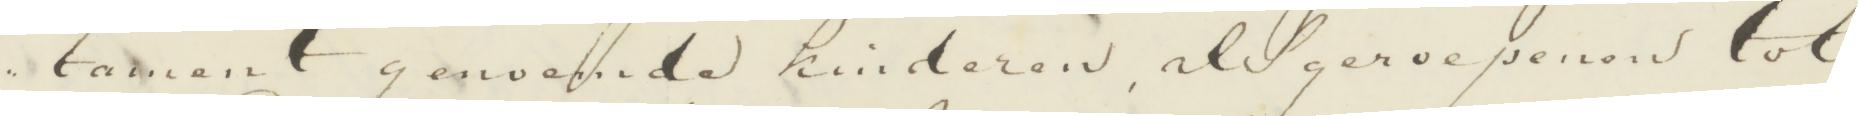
„tament genoemde kinderen, als geroepenen tot
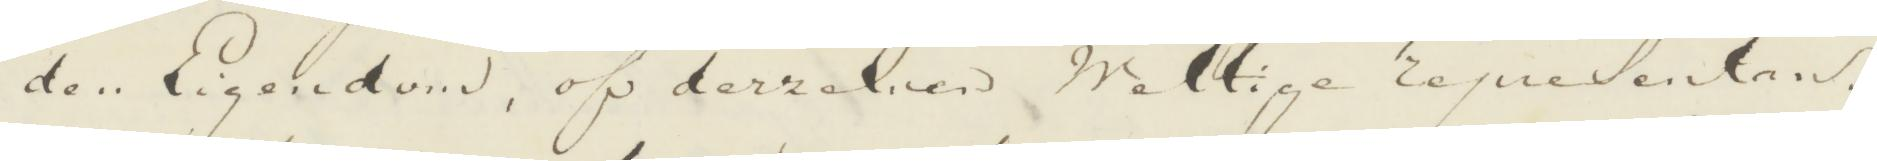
den Eigendom, op derzelven Wettige representan„
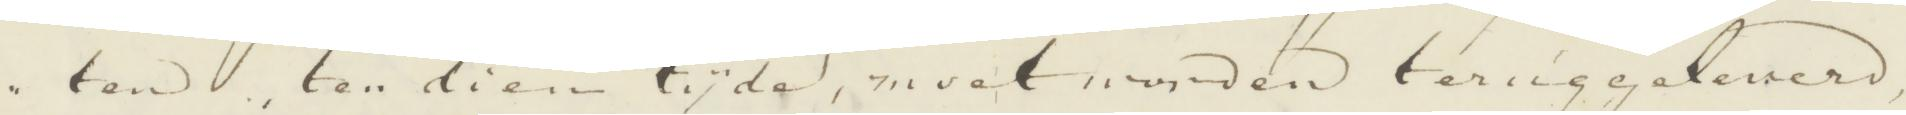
„ten, ten dien tijde, moet worden teruggeleverd,
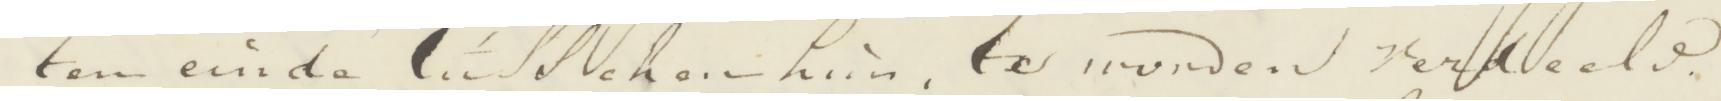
ten einde tusschen hun, te worden verdeeld.
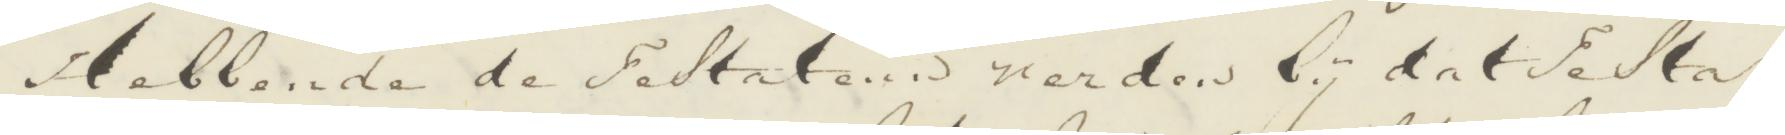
Hebbende de Testateur verder bij dat Testa
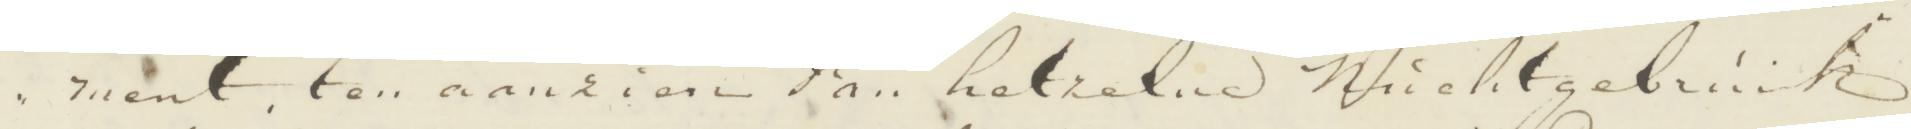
„ment, ten aanzien van hetzelve vruchtgebruik
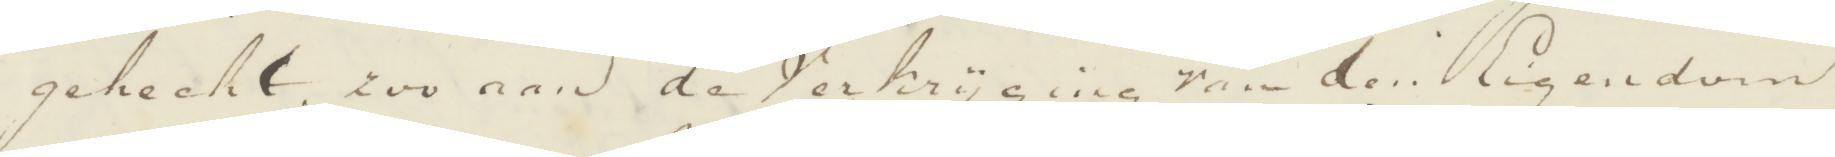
gehecht, zoo aan de Verkrijging van den Eigendom
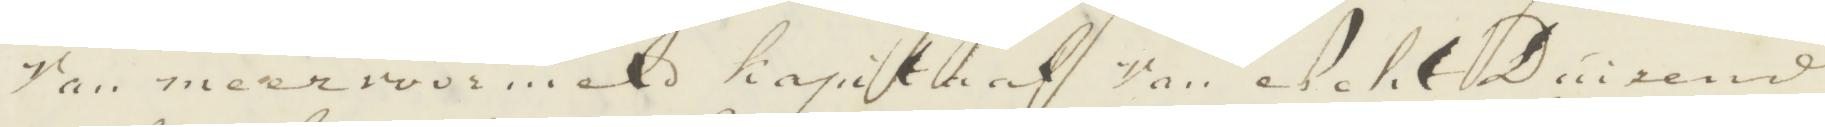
van meer voormeld kapitaal van Acht Duizend
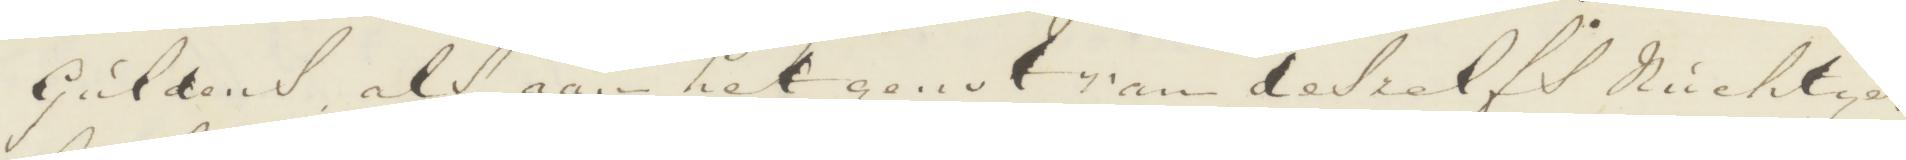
Guldens, als aan het genot van deszelfs vruchtge
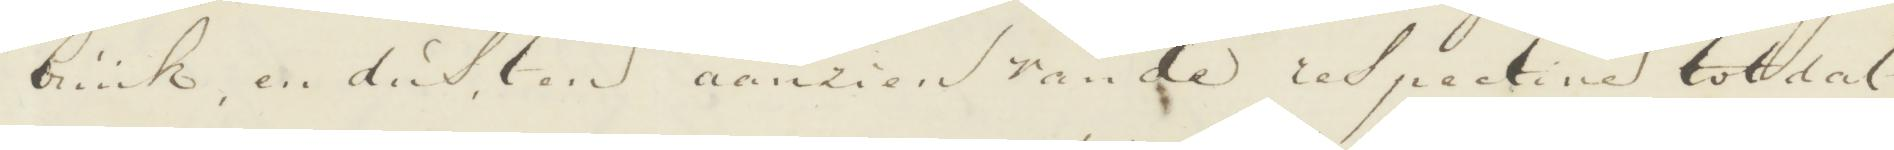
bruik, en dus, ten aanzien van de respective tot dat
